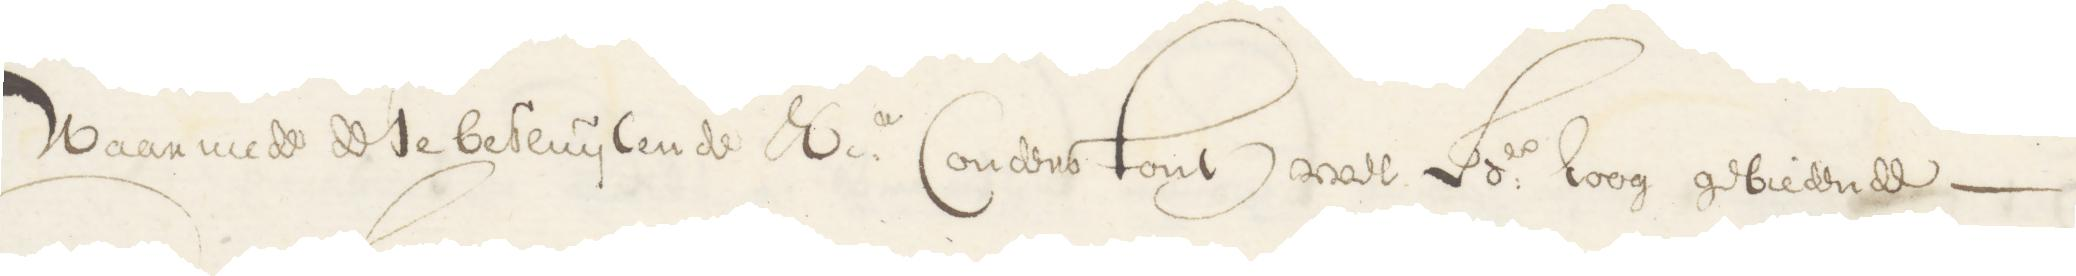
Waarmede dese besluijtende &c:a (onderstont) wel Ed:le Hoog gebiedende —
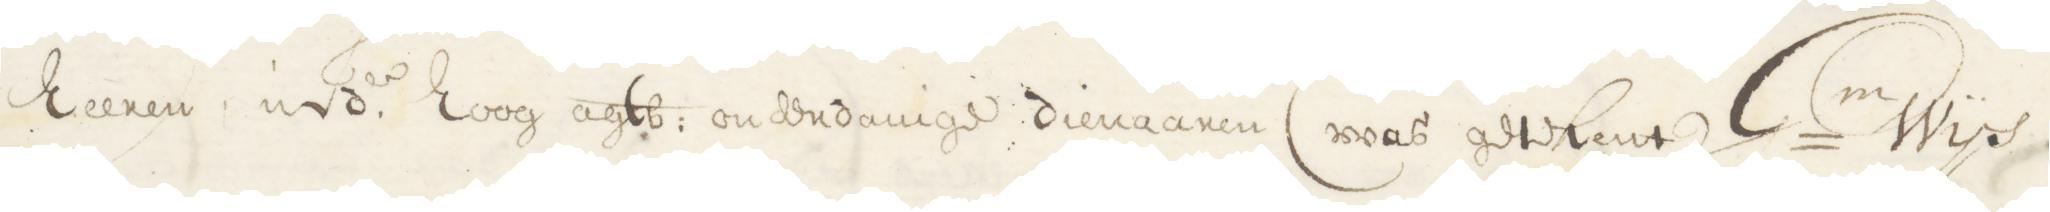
heeren, uEd.le hoog agtb: onderdanige dienaaren (was getekent) G=m Wijs
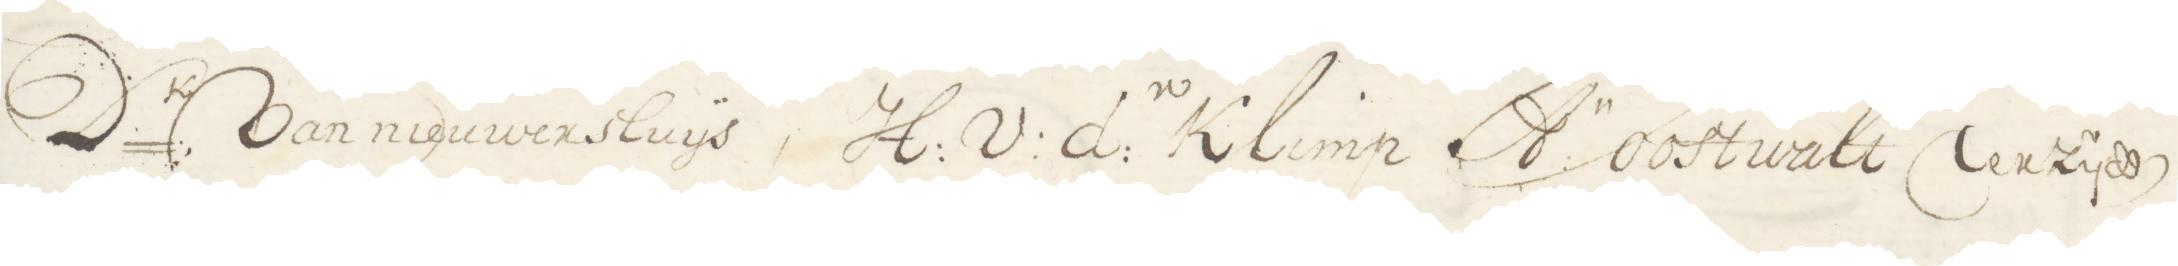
D=k Van nieuwersluijs, H: V: d:n Klimp A:n oostwalt (terzijde)
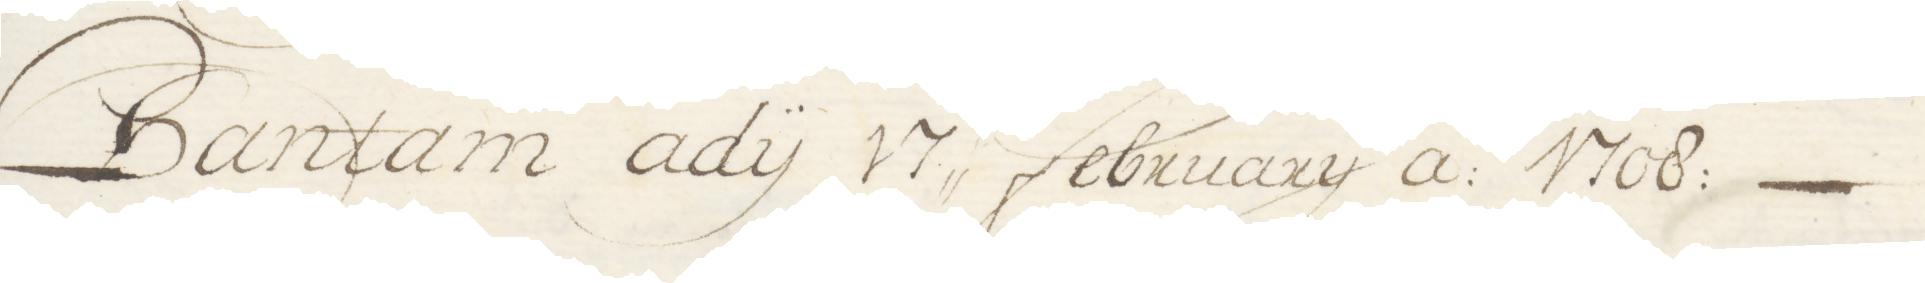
Bantam adij 17„en Februarij a:o 1708: —
